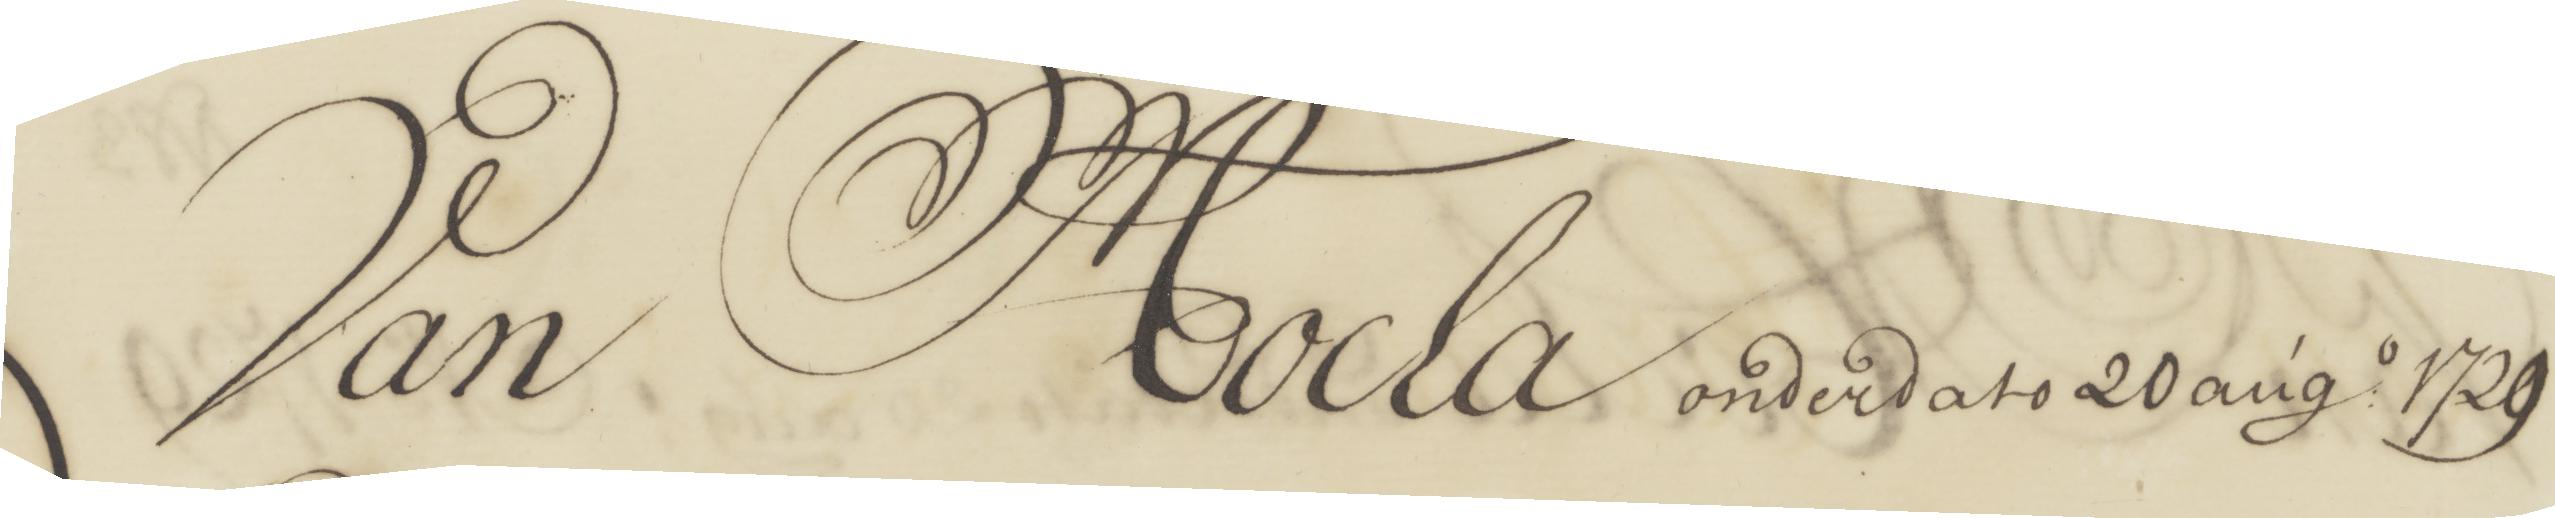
Van Mocha onderdato 20 aug:o 1729
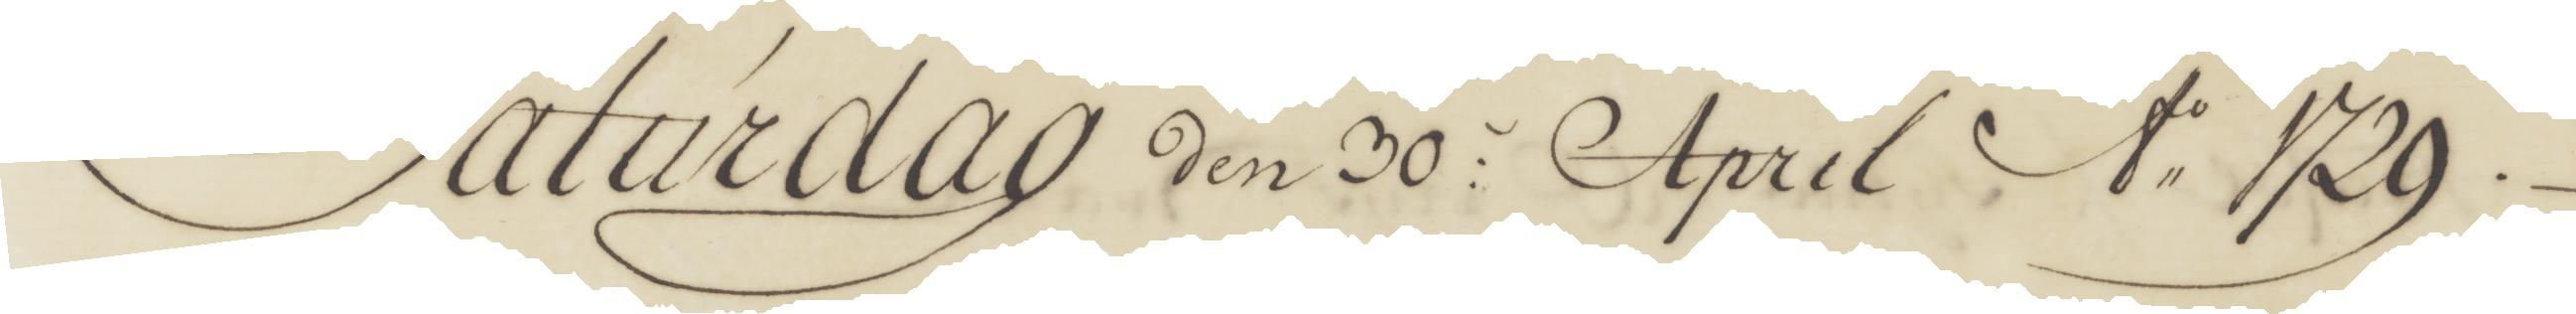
Saturdag den 30:' April A„o 1729.
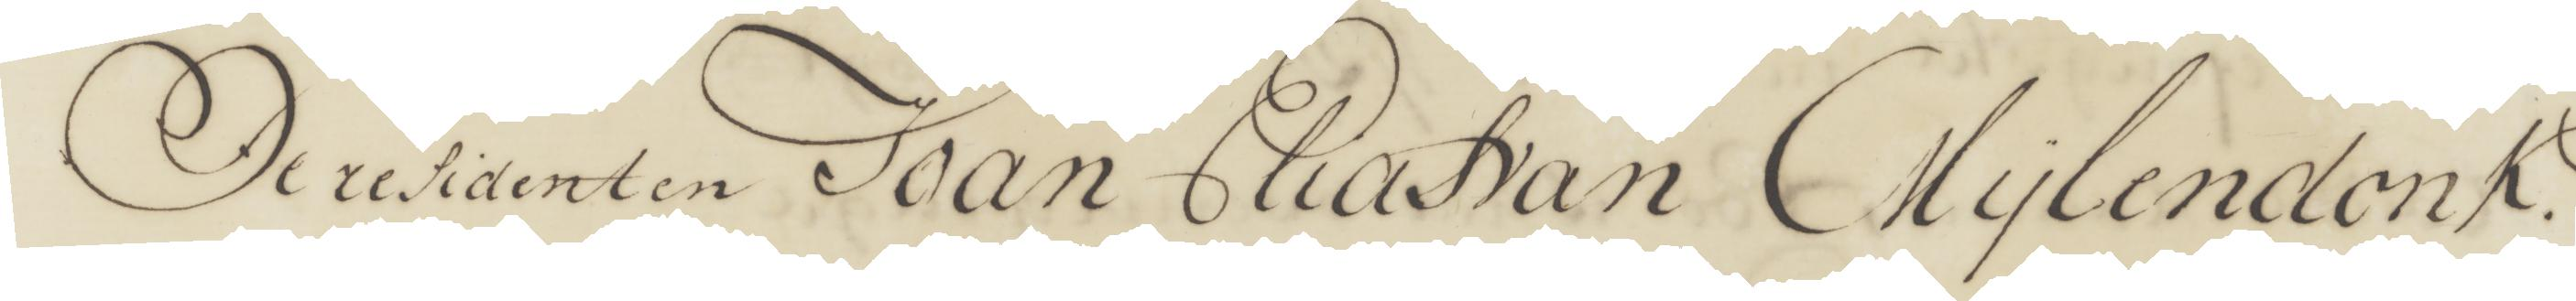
De residenten Ioan Elias van Mijlendonk.
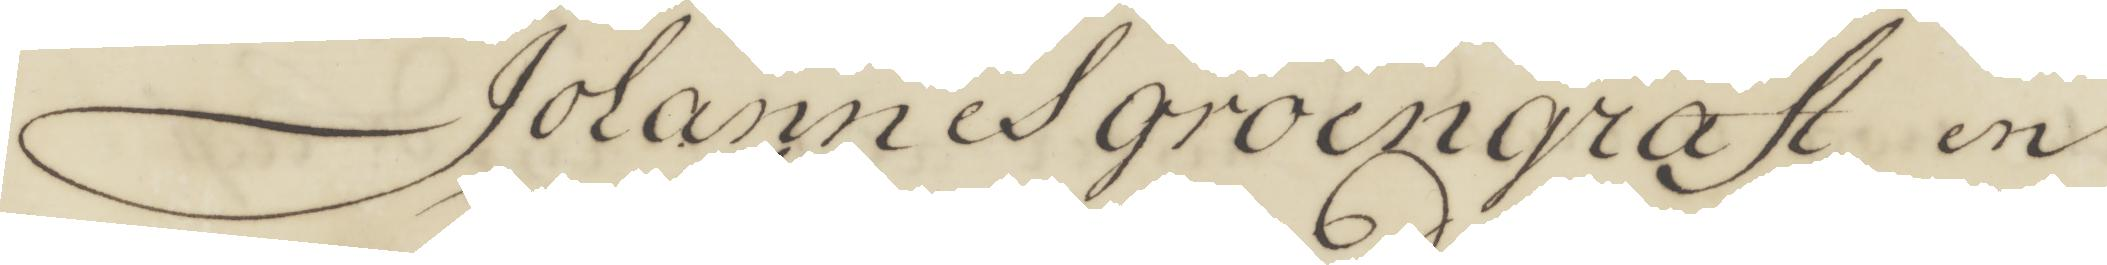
Johannes groengrast en
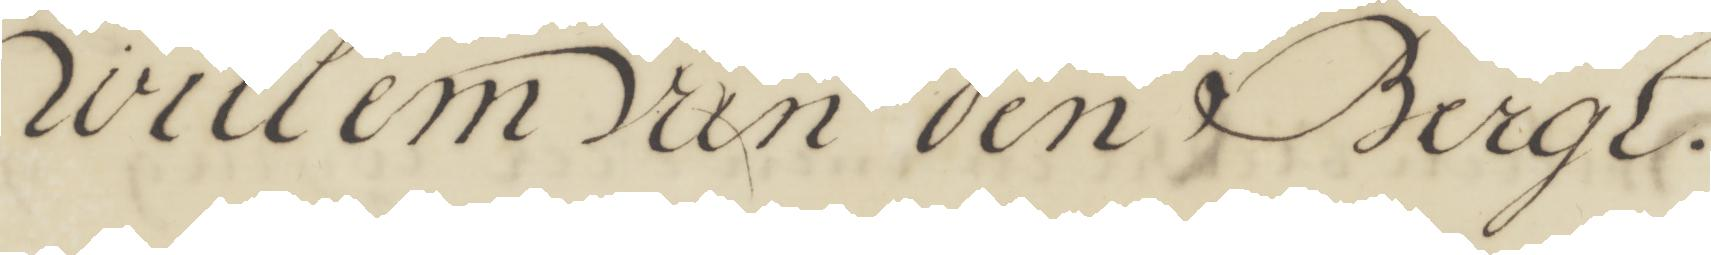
Willem van den Bergh.
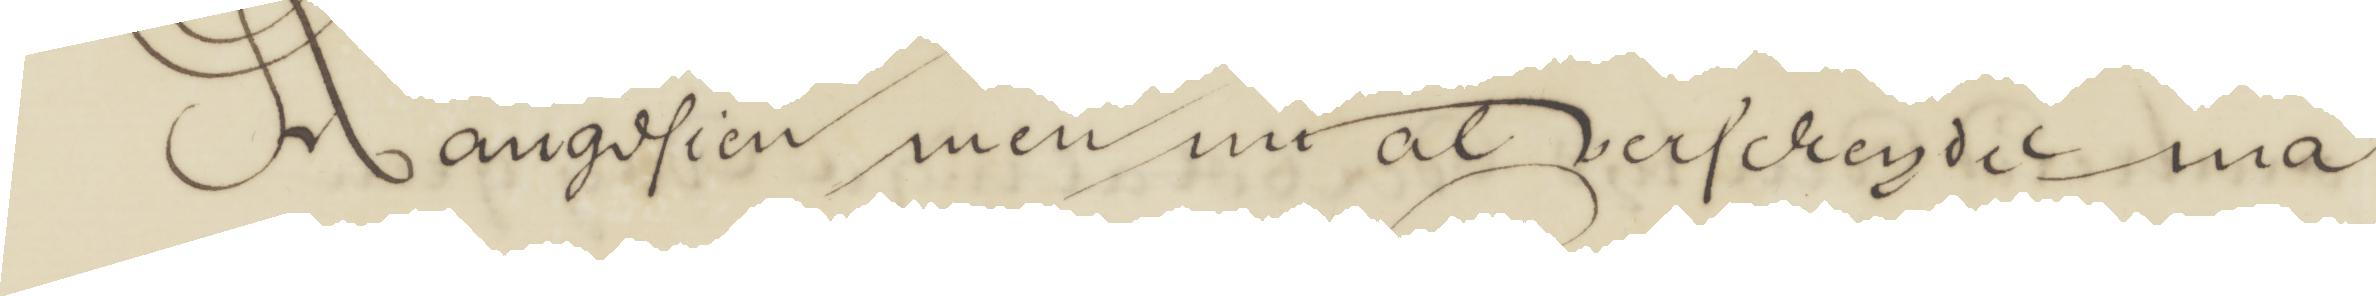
Aangesien men nu al verscheijde ma
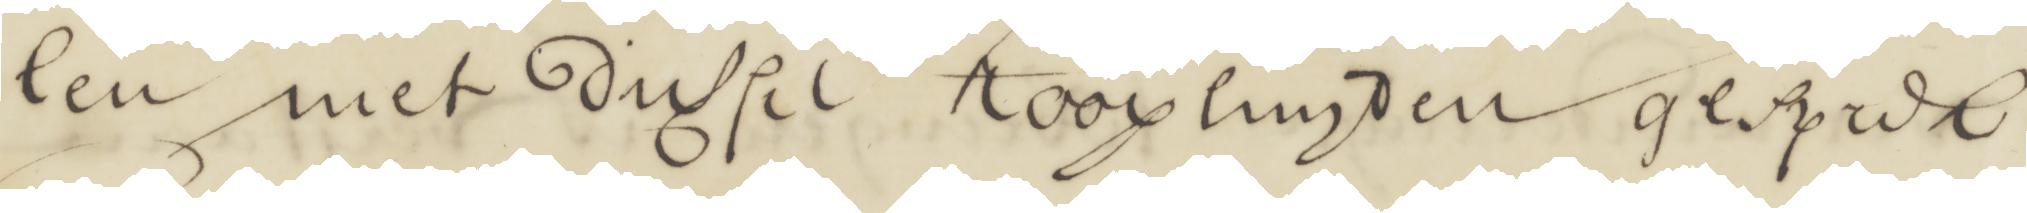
len met diverse koopluyden gesprek
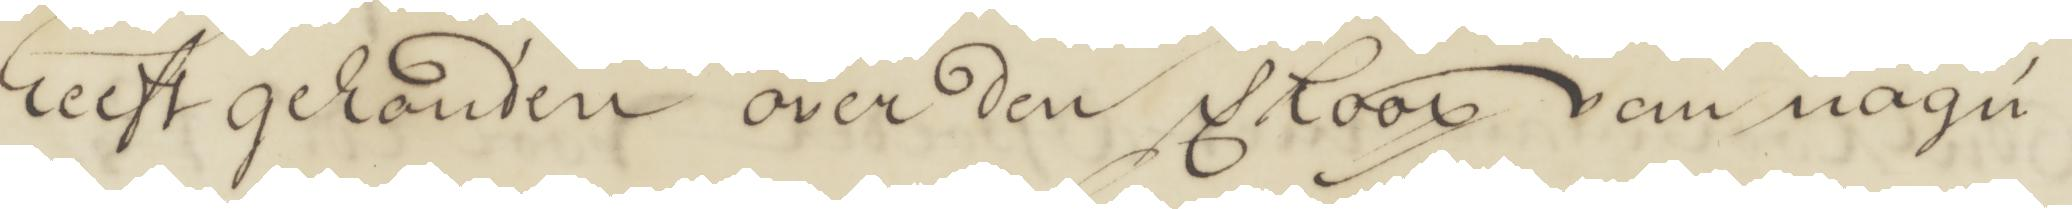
heeft gehouden over den verkoop van nagu
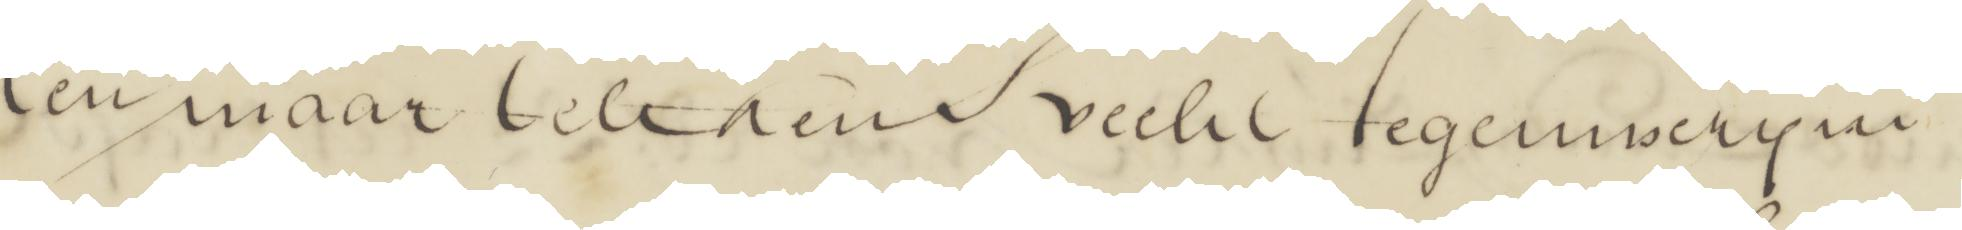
len maar telckens veele tegenwerpin
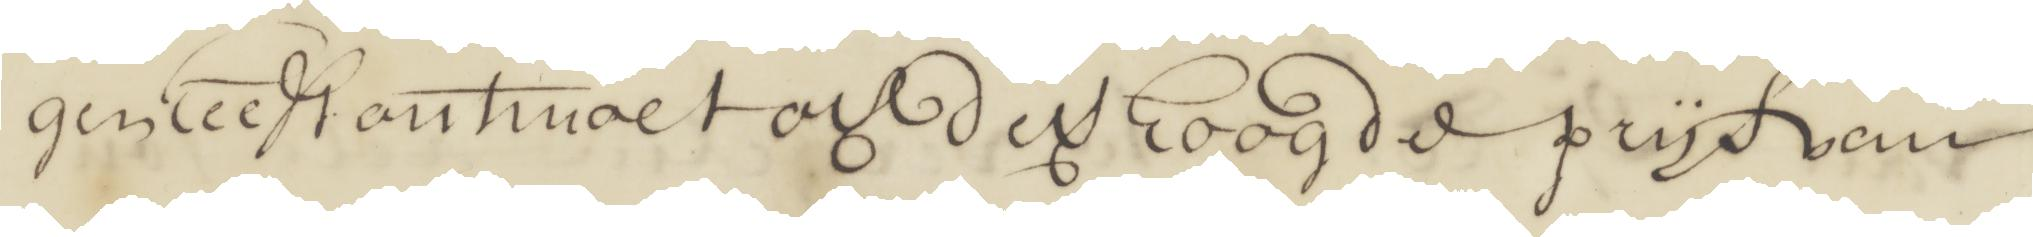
gen heeft ontmoet over de verhoogde prijs van
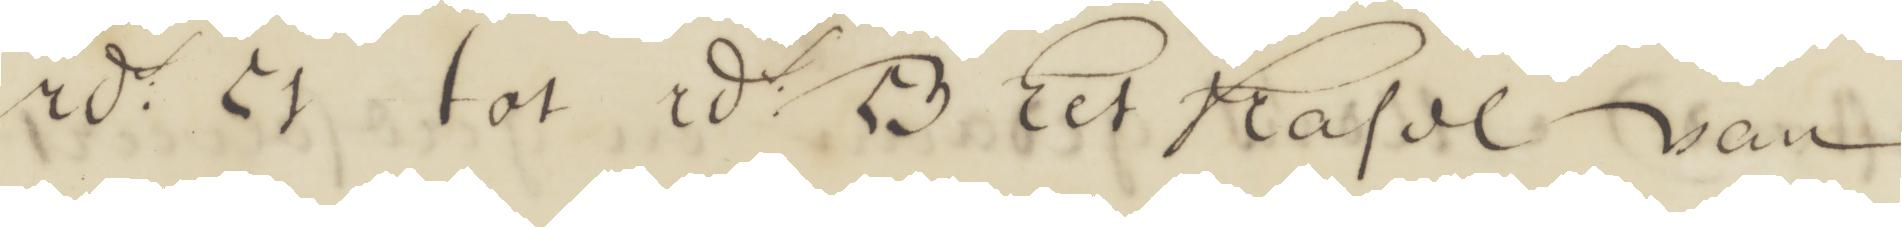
rd:s 51 tot rd:s 53 het frasel van
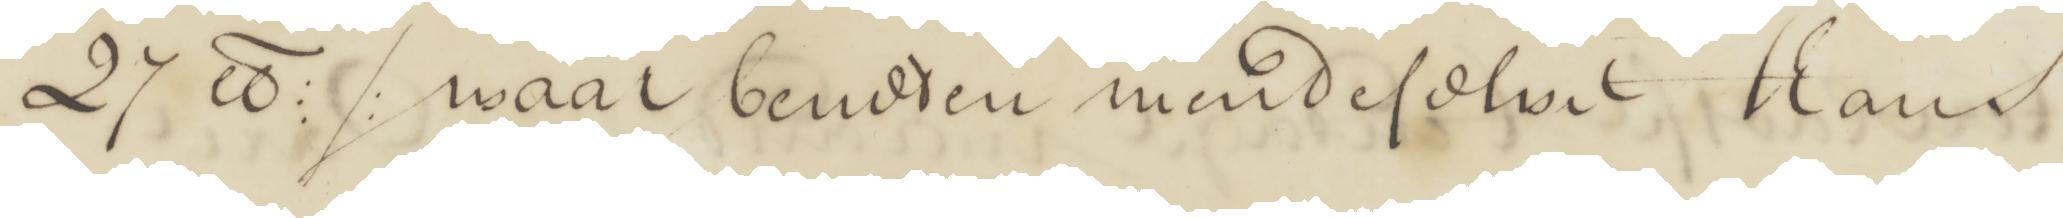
27 lb: /: waar beneden men deselve thans
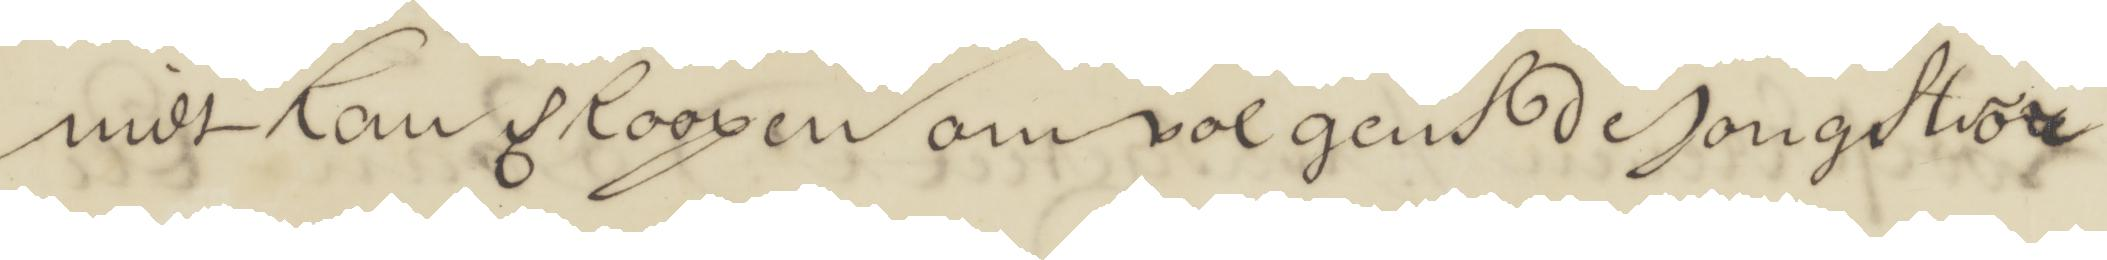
niet kan verkoopen om volgens de jongste or
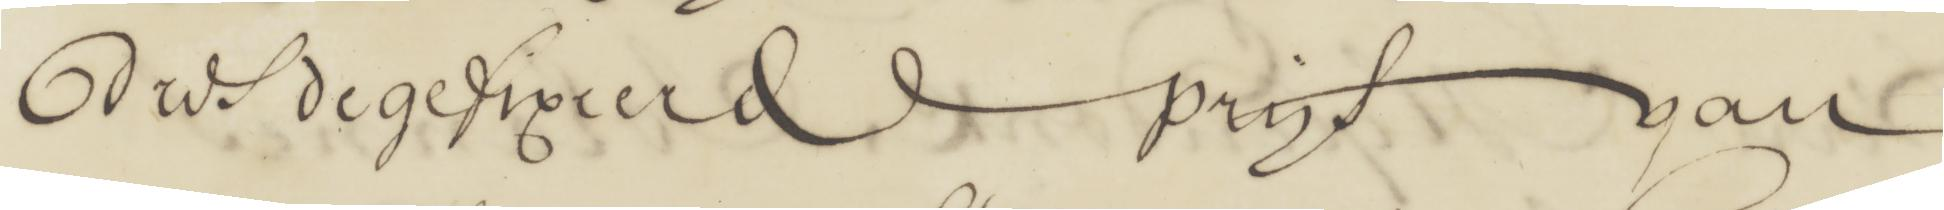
dres de gefixeerde prijs van
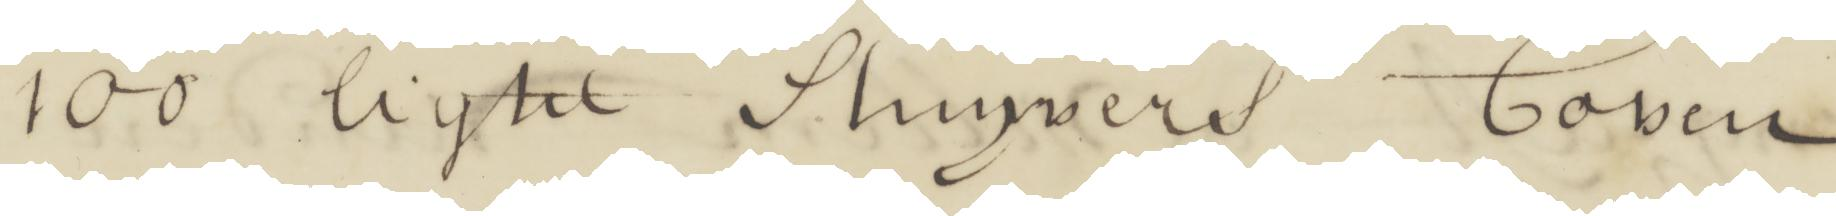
100 ligte stuyvers boven
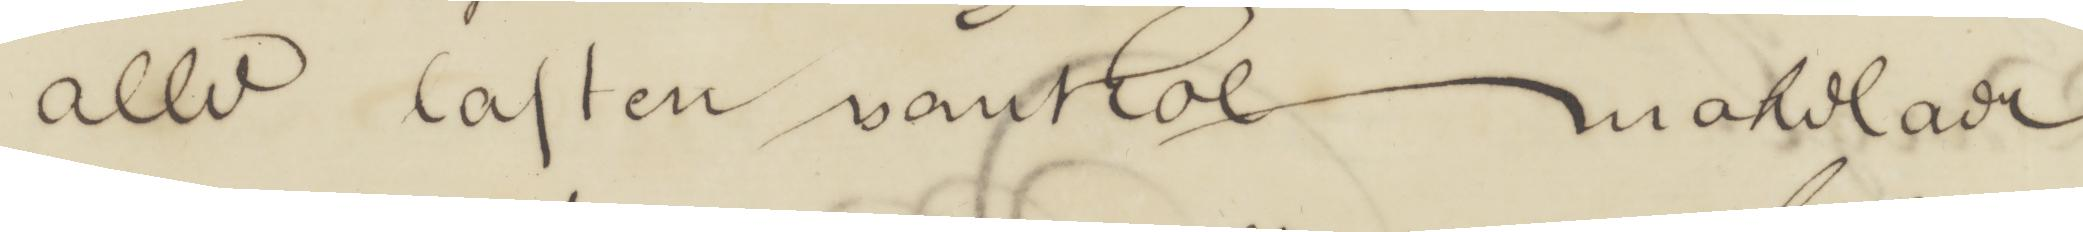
alle lasten vanthol makelaer
